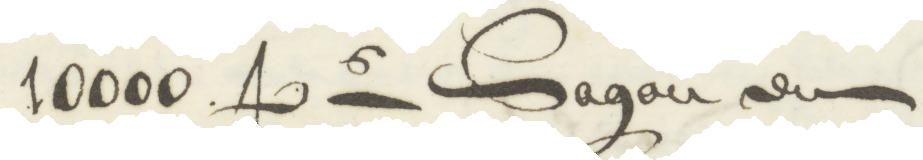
10000. p=s Sagou en
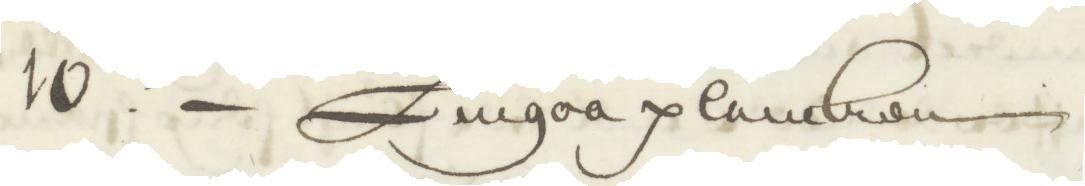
10. — Lingoa plancken
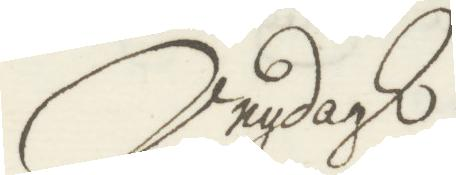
Vrijdagh
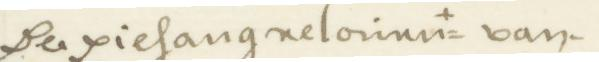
de piesang retourn=t van
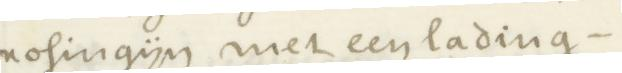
rosingijn met een lading —
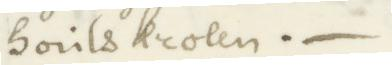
houts kolen. —
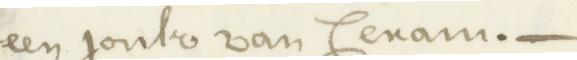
een jonk van Ceram. —
